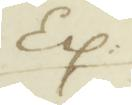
Ex:
